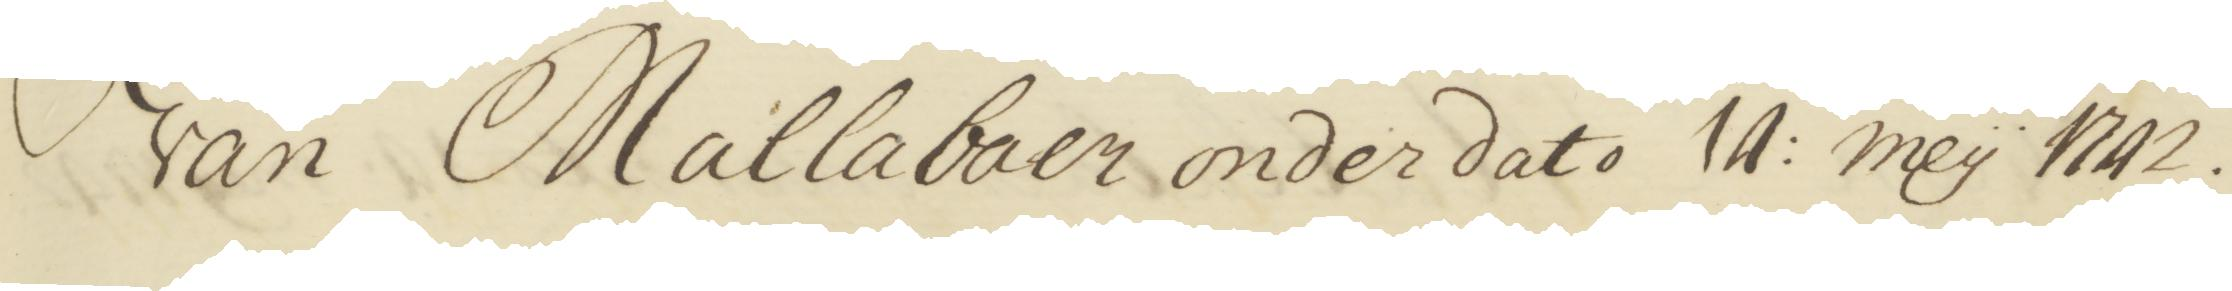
Van Mallabaer onder dato 14: meij 1742.
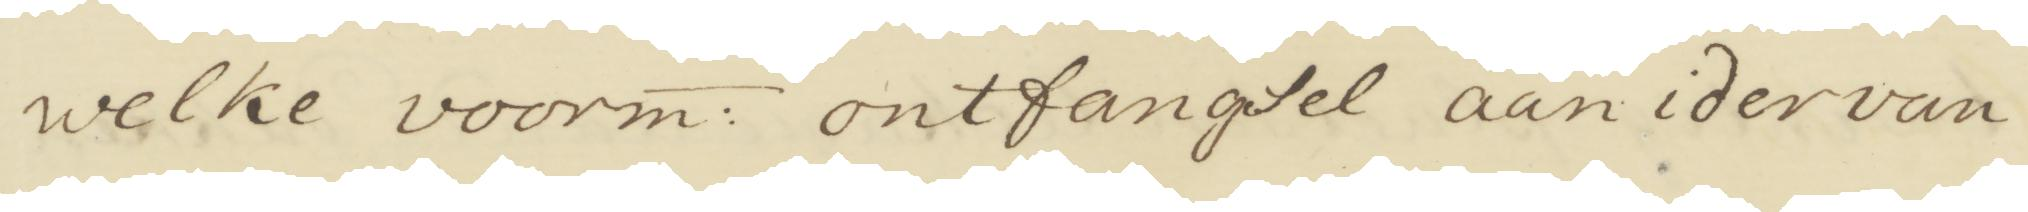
welke voorm: ontfangsel aan ider van
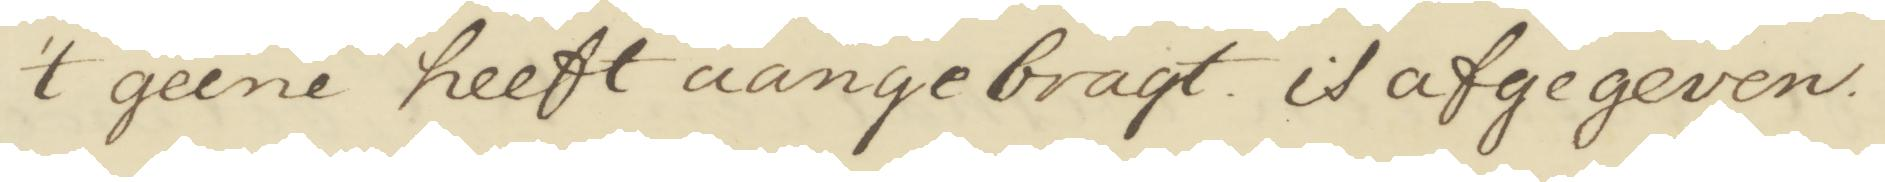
’t geene heeft aangebragt is afgegeven.
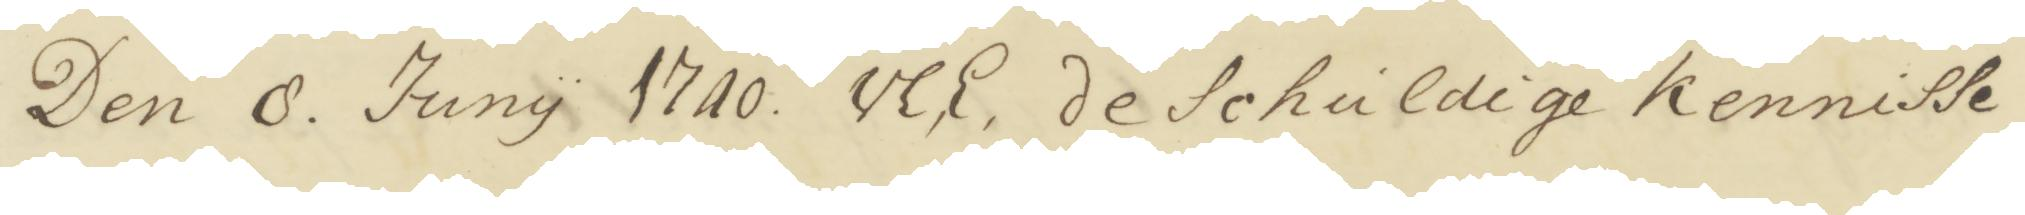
Den 8. Iunij 1740. VE,E, de schuldige kennisse
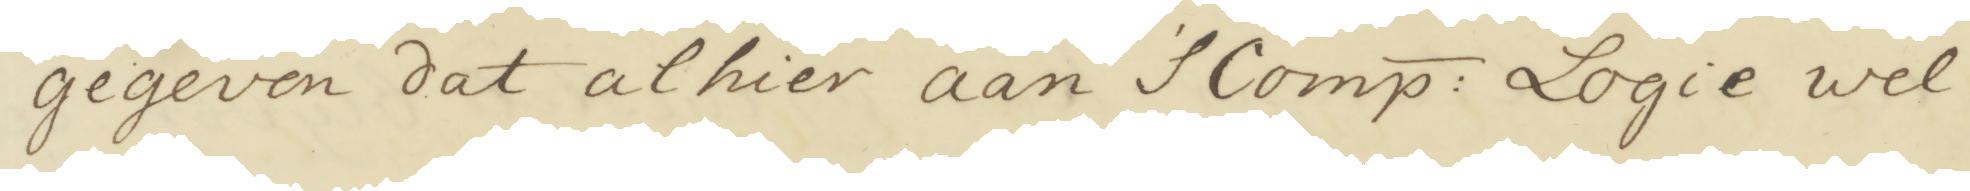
gegeven dat alhier aan ’s Comp: Logie wel
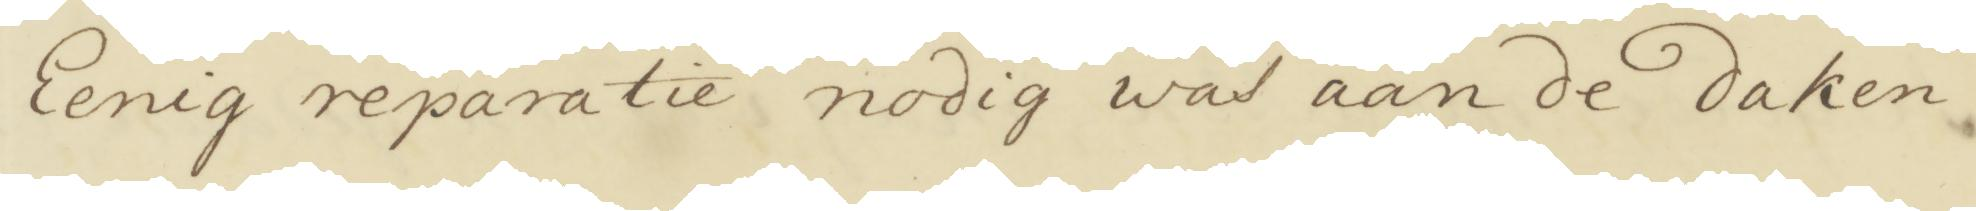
Eenig reparatie nodig was aan de daken
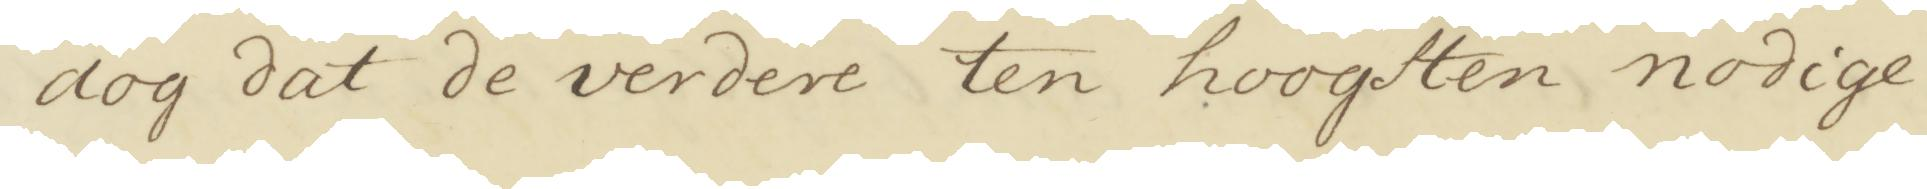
dog dat de verdere ten hoogsten nodige
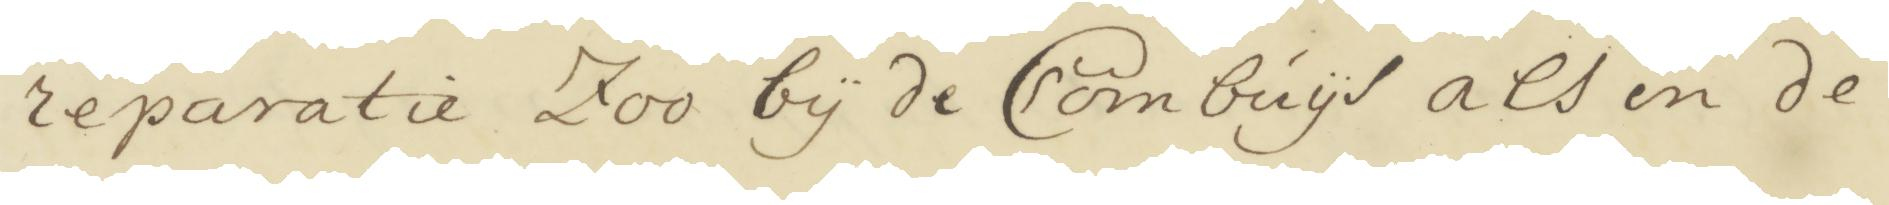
reparatie zoo bij de Combuijs als in de
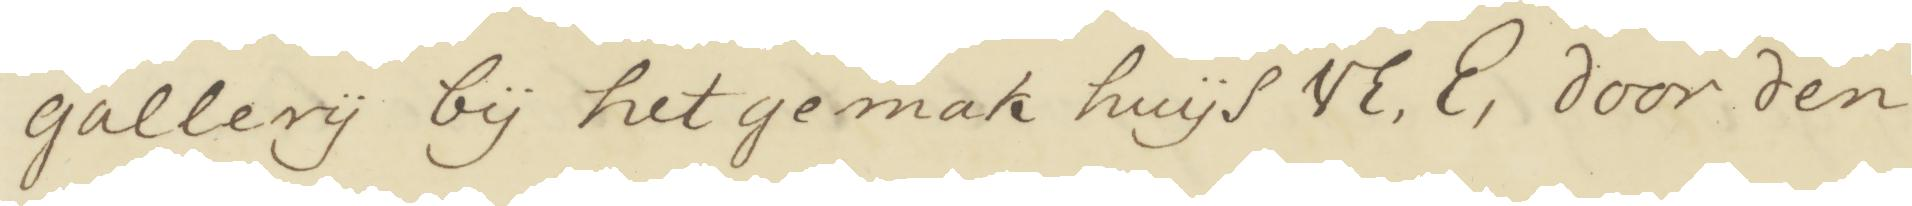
gallerij bij het gemak huijs VE, E, door den
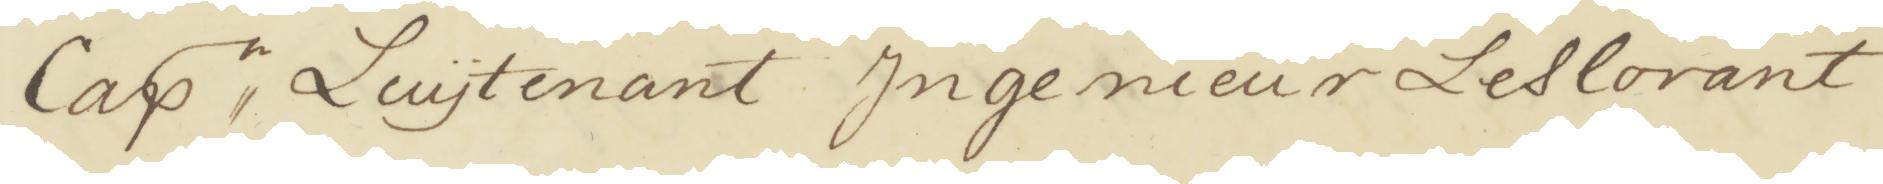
Cap„n Luijtenant Jngenieur Leslorant
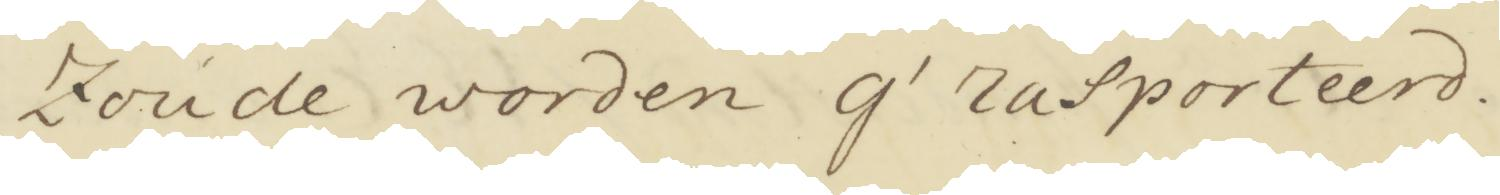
zoude worden g’ rasporteerd.
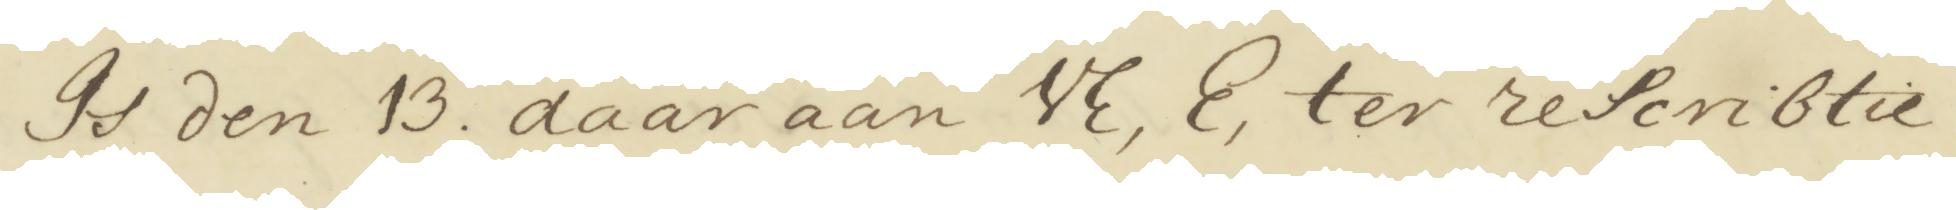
Is den 13. daar aan VE, E, ter rescribtie
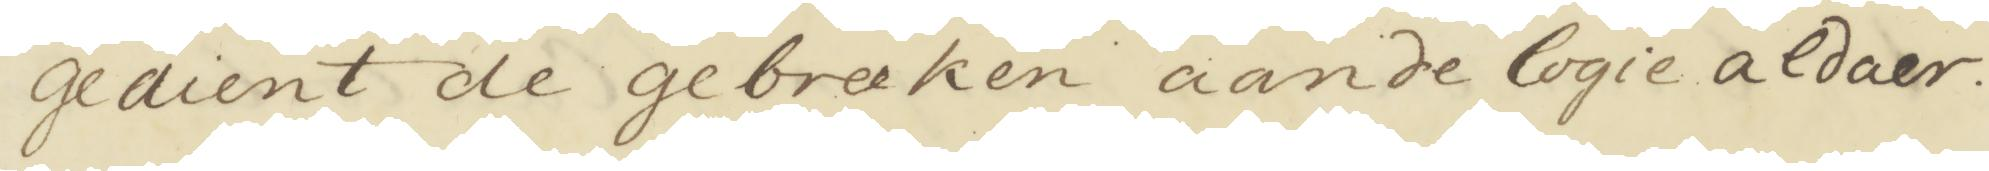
gedient de gebreeken aan de logie aldaer.
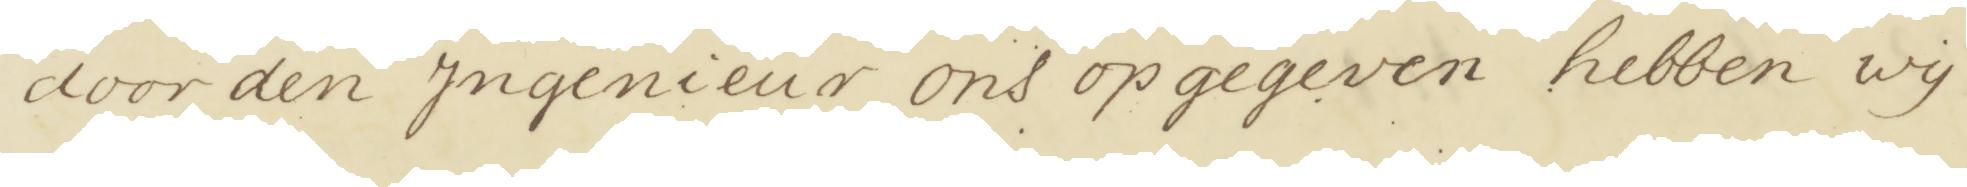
door den Jngenieur ons opgegeven hebben wij
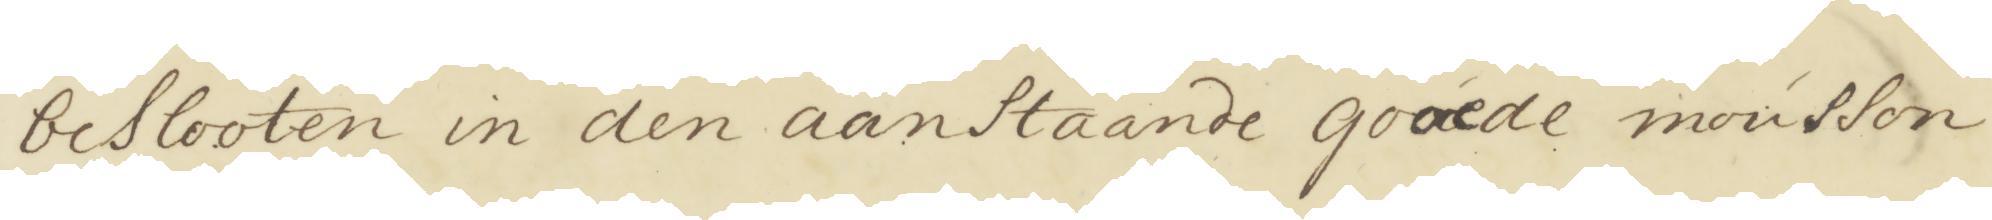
beslooten in den aanstaande goaede mousson
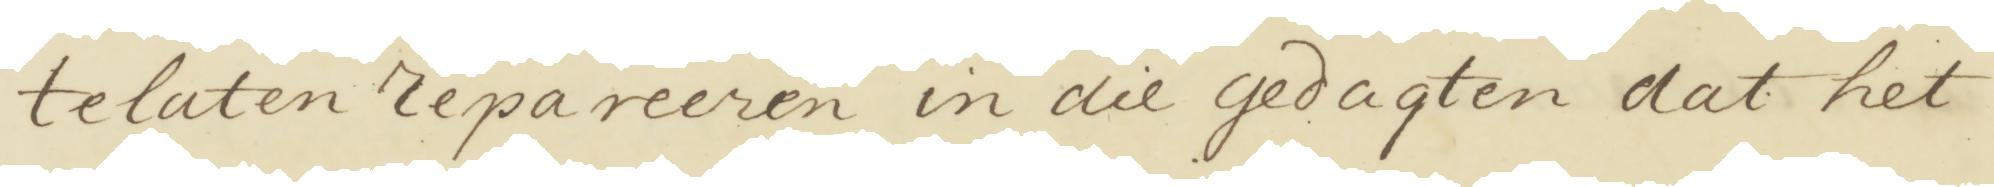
te laten repareeren in die gedagten dat het
